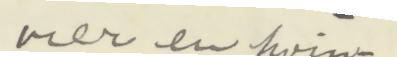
vier en twin
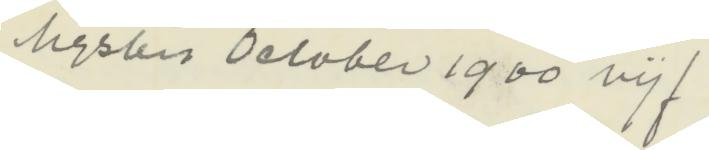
tigsten October 1900 vijf
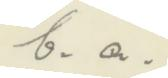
b. a.
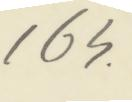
164.
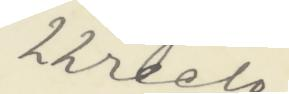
22 recto
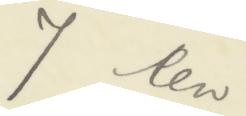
7 een
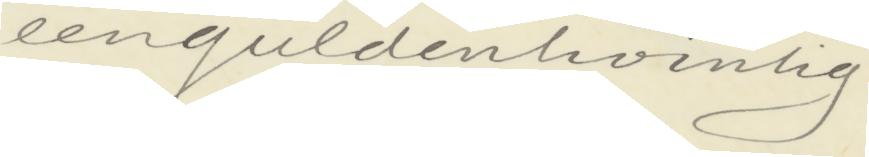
een gulden twintig
